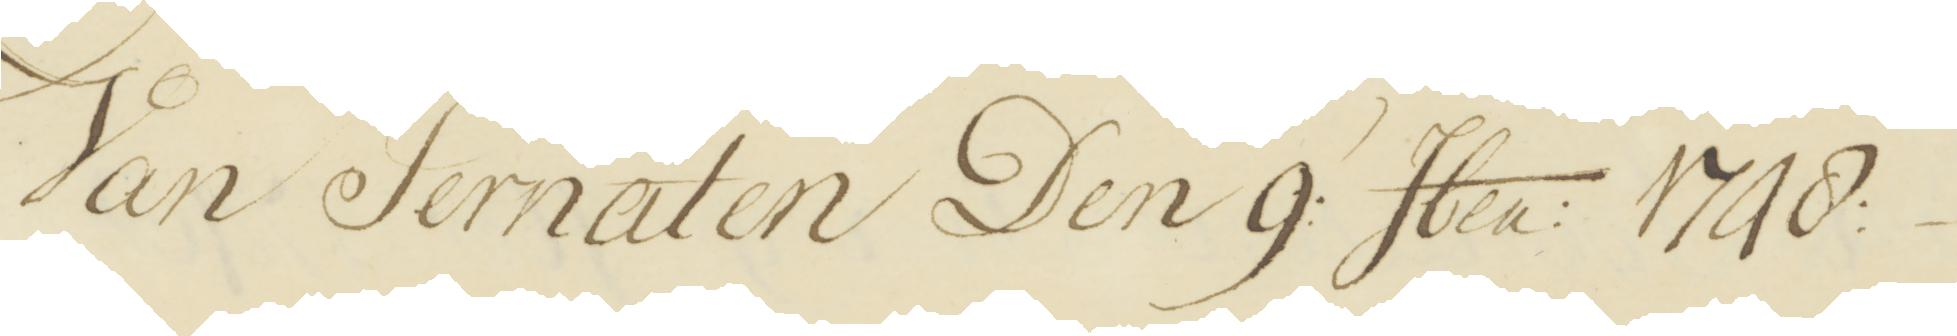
Van Ternaten Den 9:' 7ber: 1748:
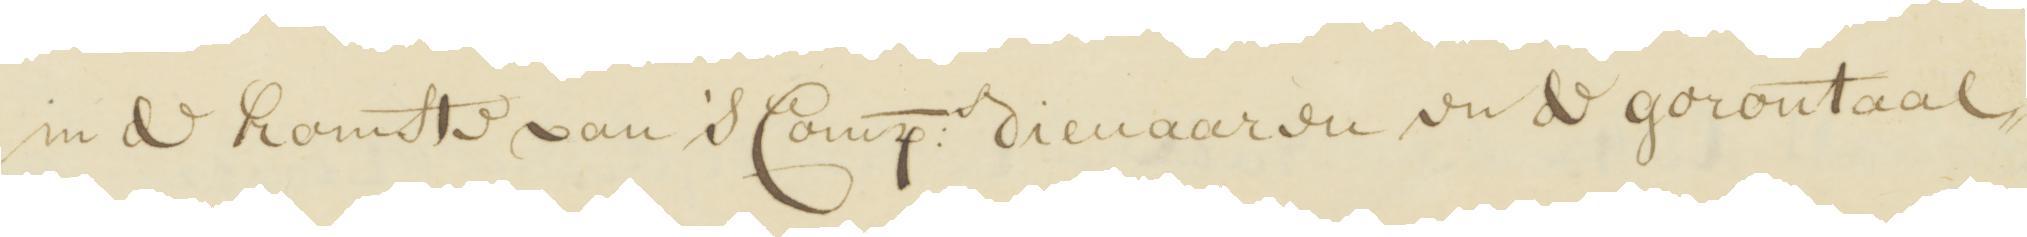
in de komste van ’s Comp: dienaaren en de gorontaal
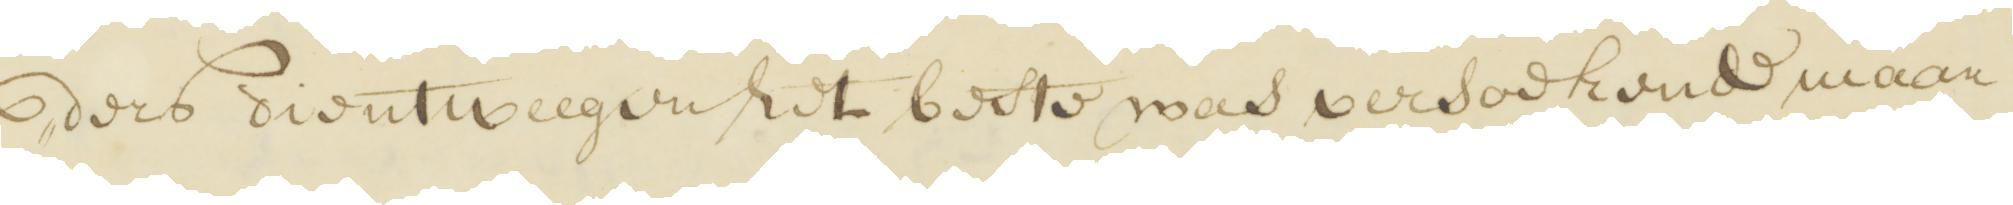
„ders dientweegen het beste was versoekende, maar
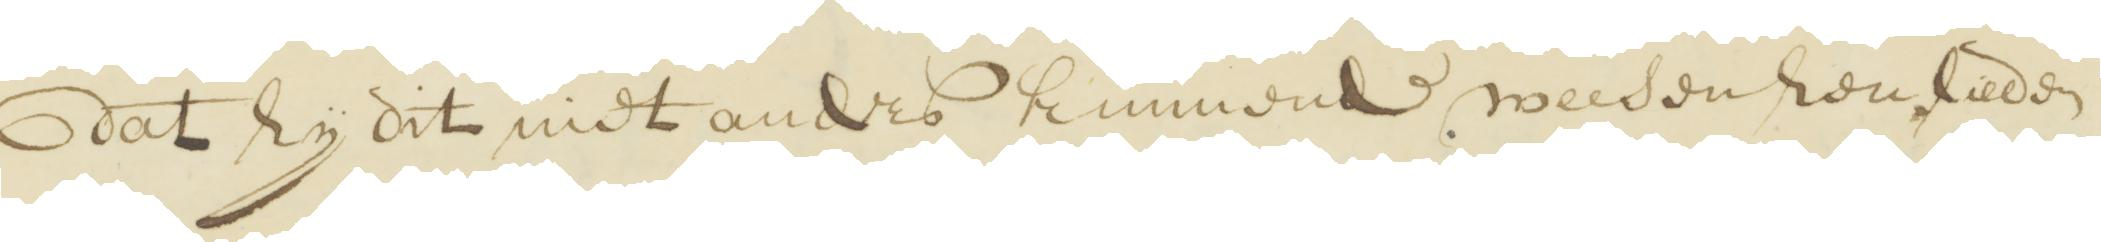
dat hij dit niet anders kunnende weesen hen lieden
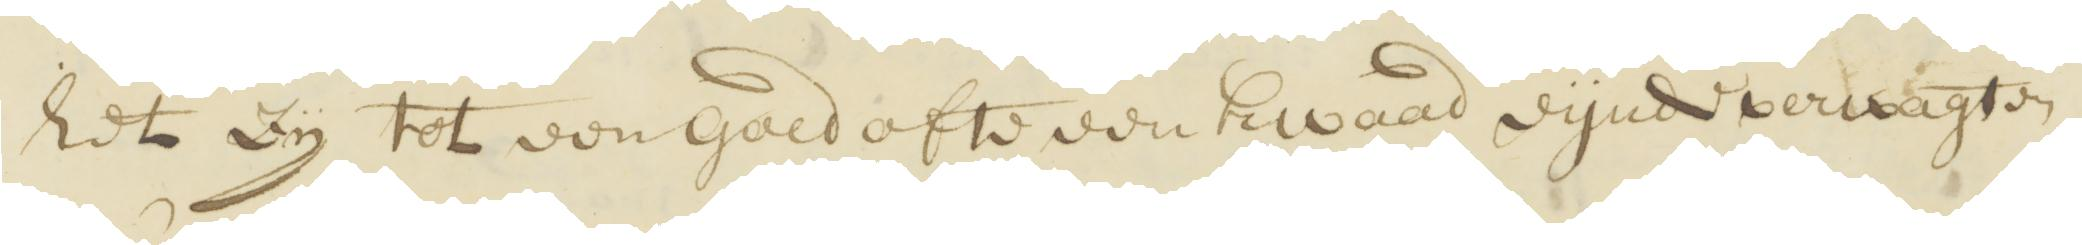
het zij tot een goed ofte een kwaad eijnde verwagten
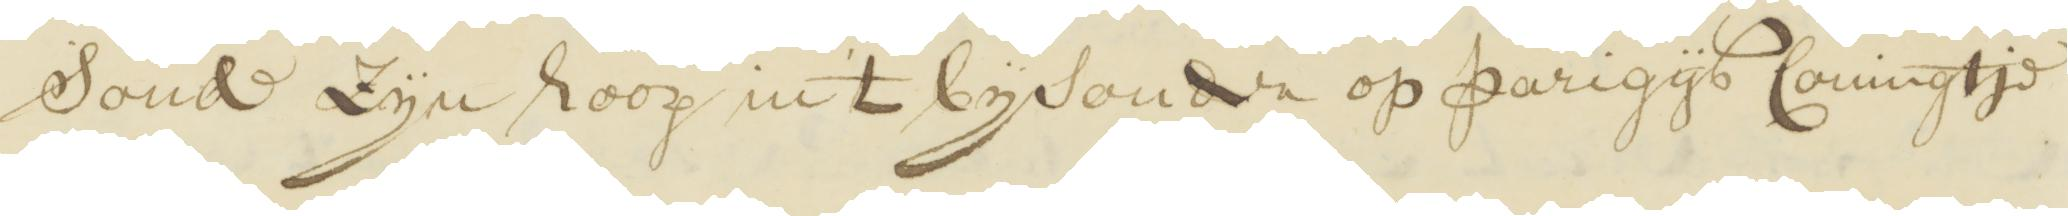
soude zijn hoop in’t bijsonder op parigijs Coningtje
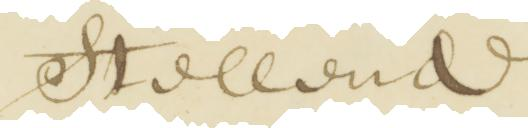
stellende
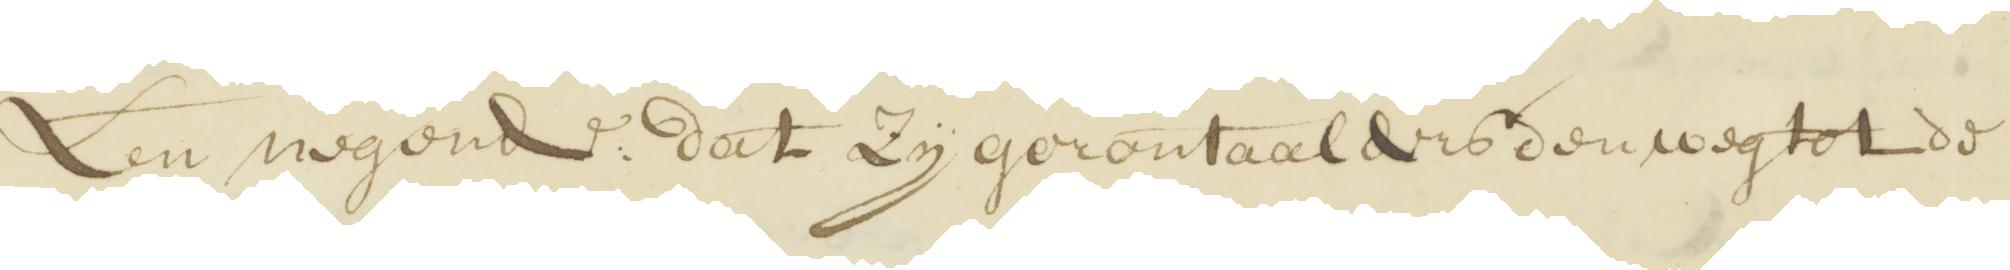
Ten negende: dat zij gorontaalders den weg tot de
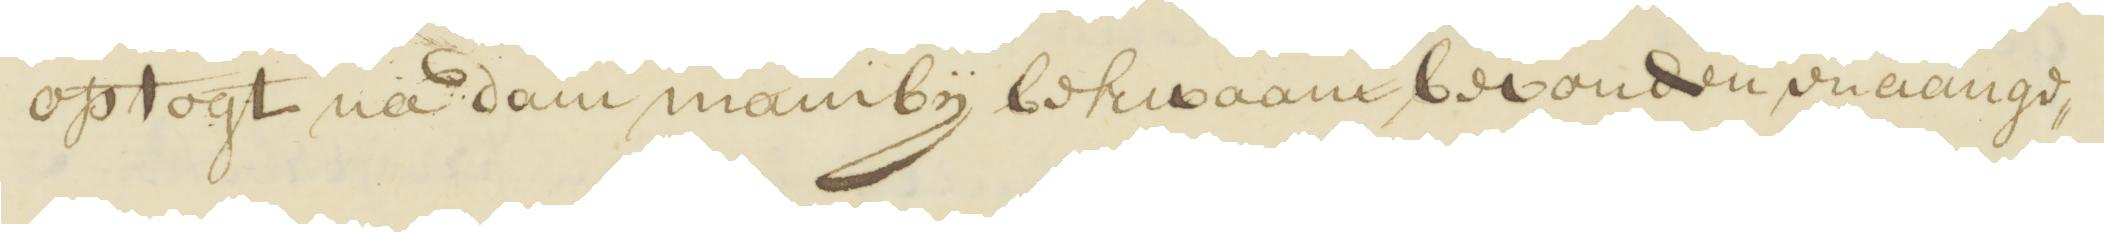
optogt na dain mauibij bekwaam bevonden, en aange„
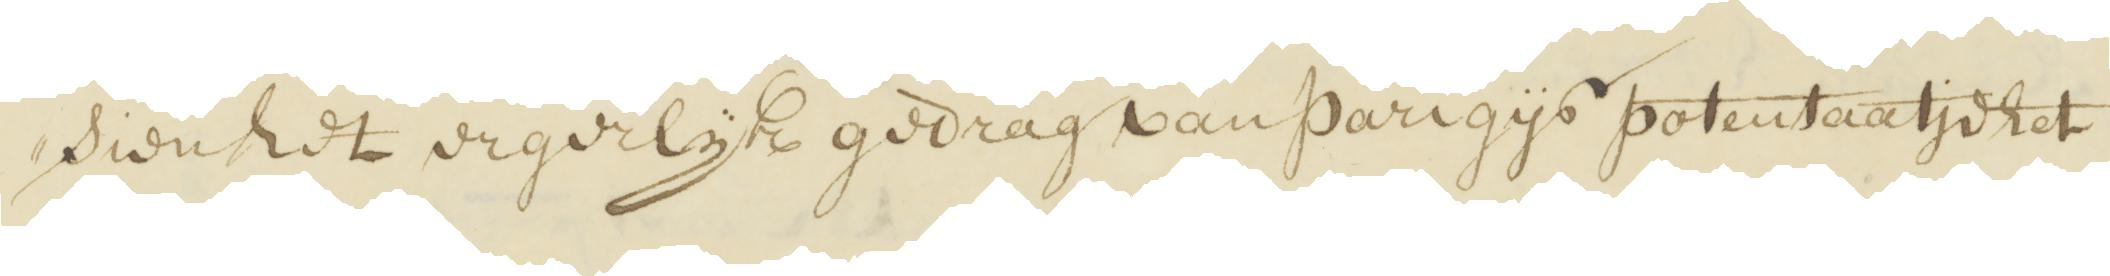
„sien het ergerlijk gedrag van parigijs potentaatje het
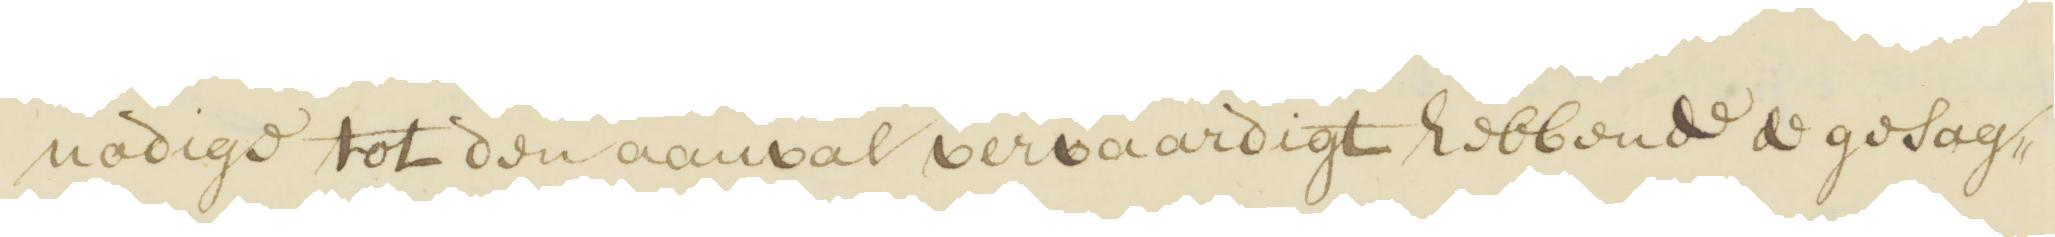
nodige tot den aanval vervaardigt hebbende de gesag„
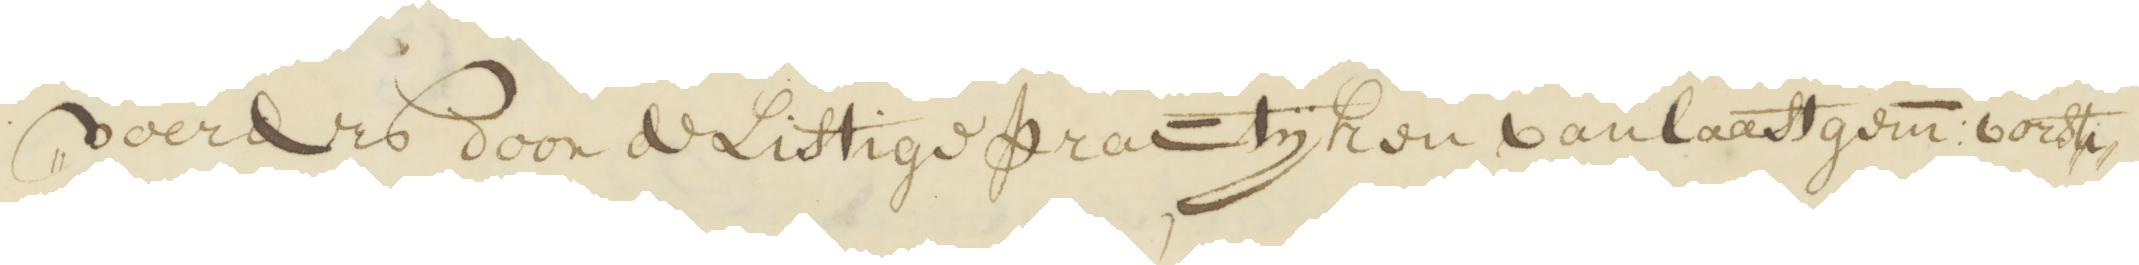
„voerders door de Listige practijken van laastgem: vorsti„
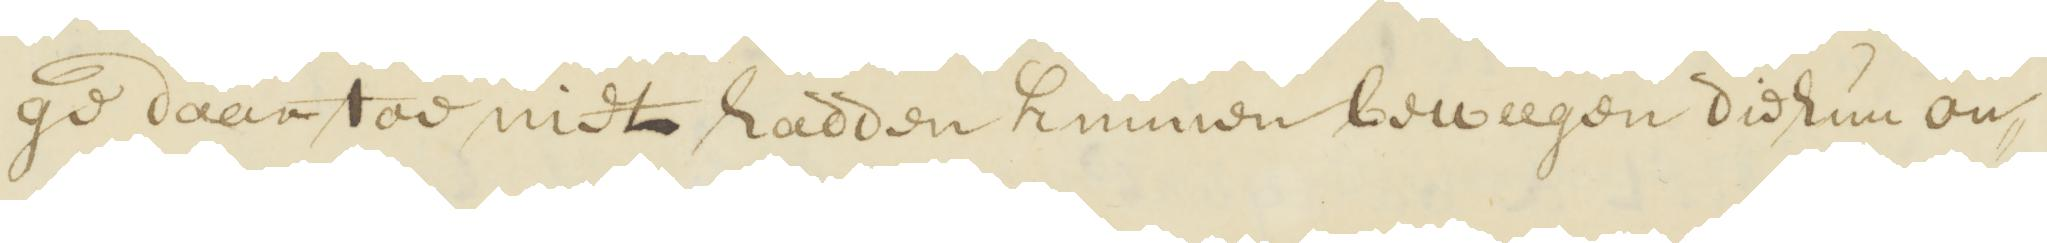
ge daar toe niet hadden kunnen beweegen die hun on„
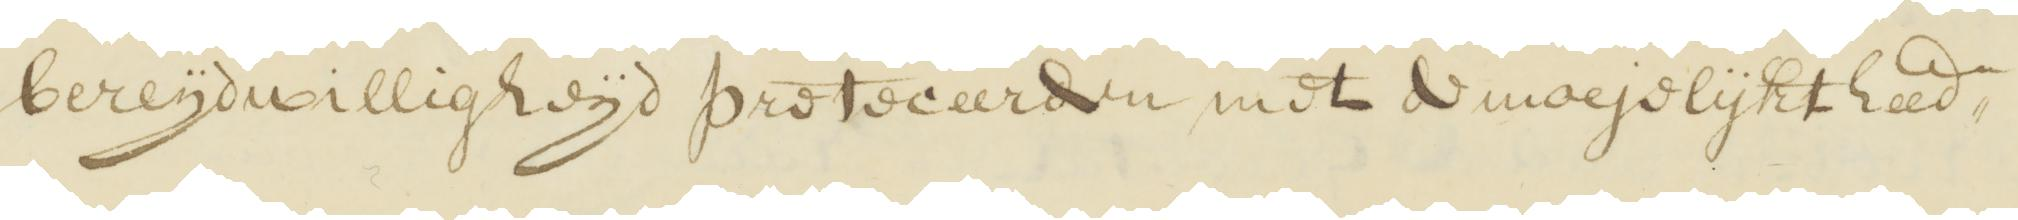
bereijdwilligheijd preteceerden met de moejelijktheed„
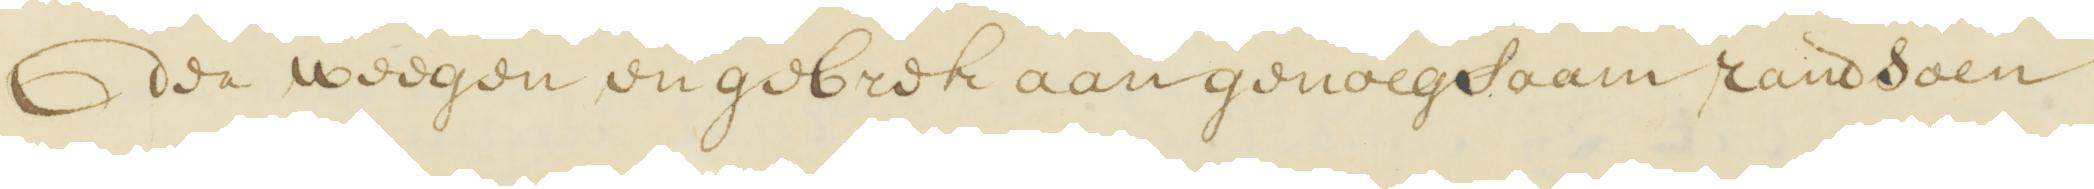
der weegen en gebrek aan genoegsaam randsoen
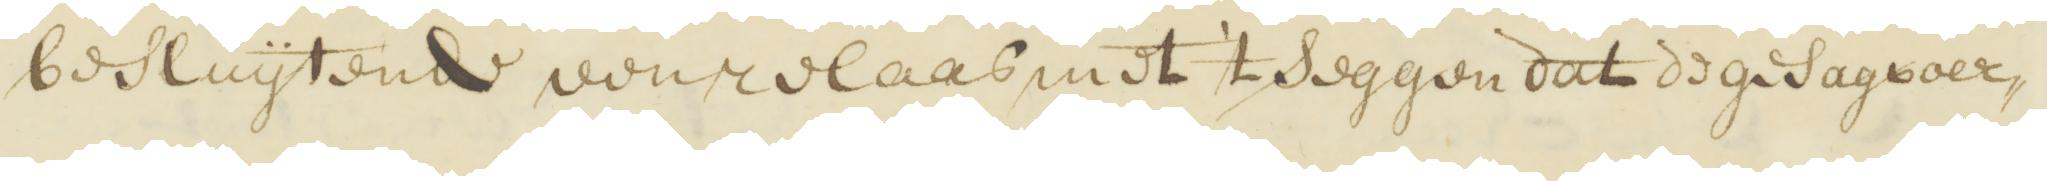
besluijtende een relaas met ’t seggen dat de gesagvoer„
